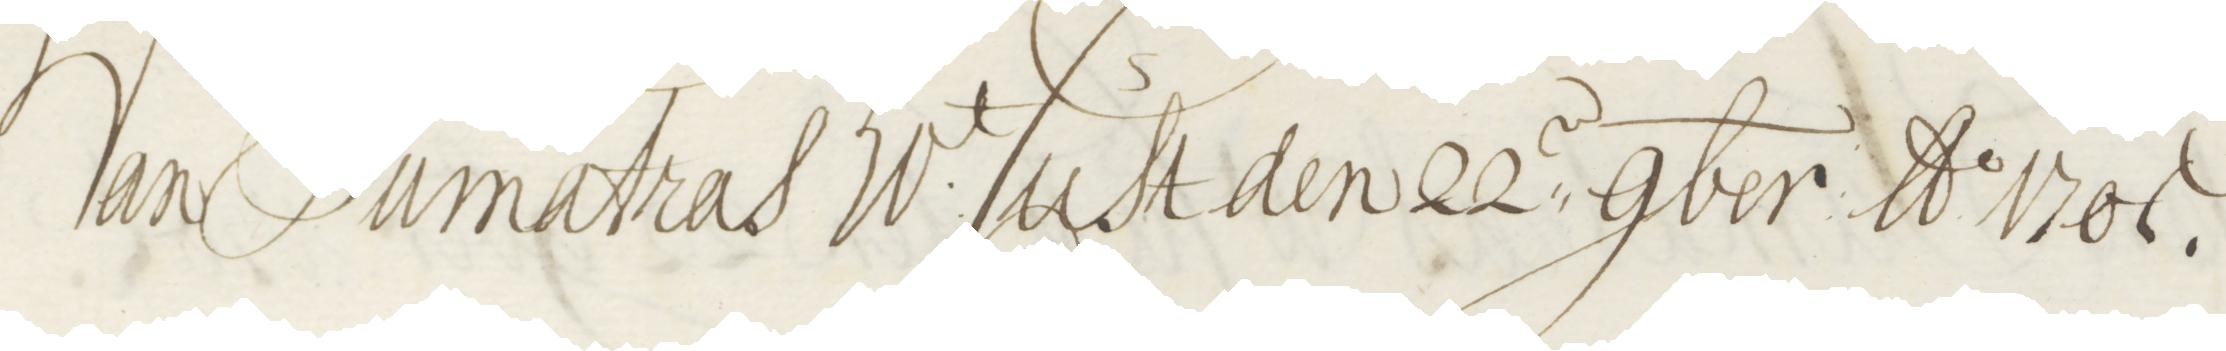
Van Sumatras w:t Cust den 22„en 9ber A.o 1705.
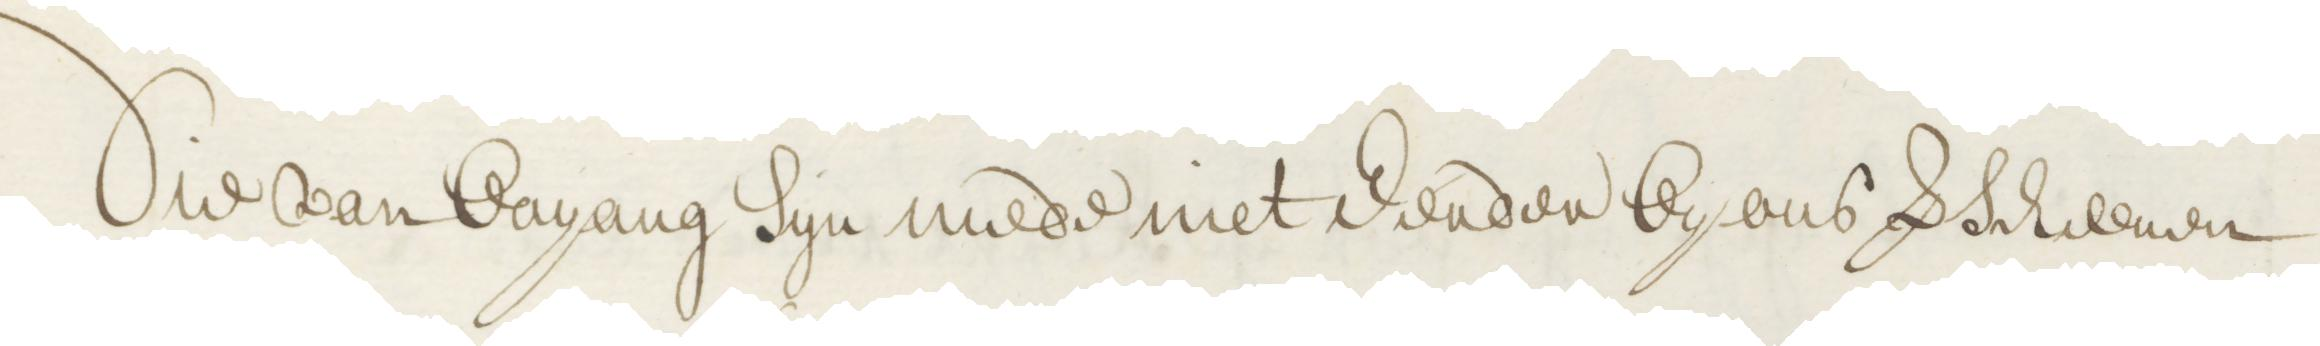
Die van bayang syn mede niet Eerder bij ons verscheenen
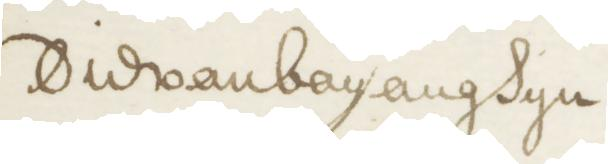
die van baijang sijn
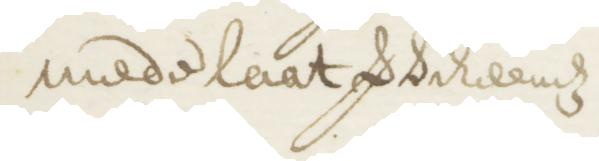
mede laat verscheenen
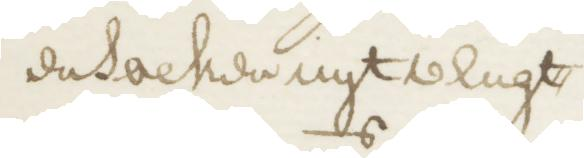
ensoeken uytvlugt„
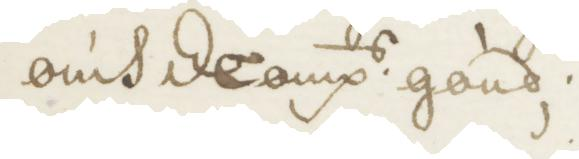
en is E comp:s goud
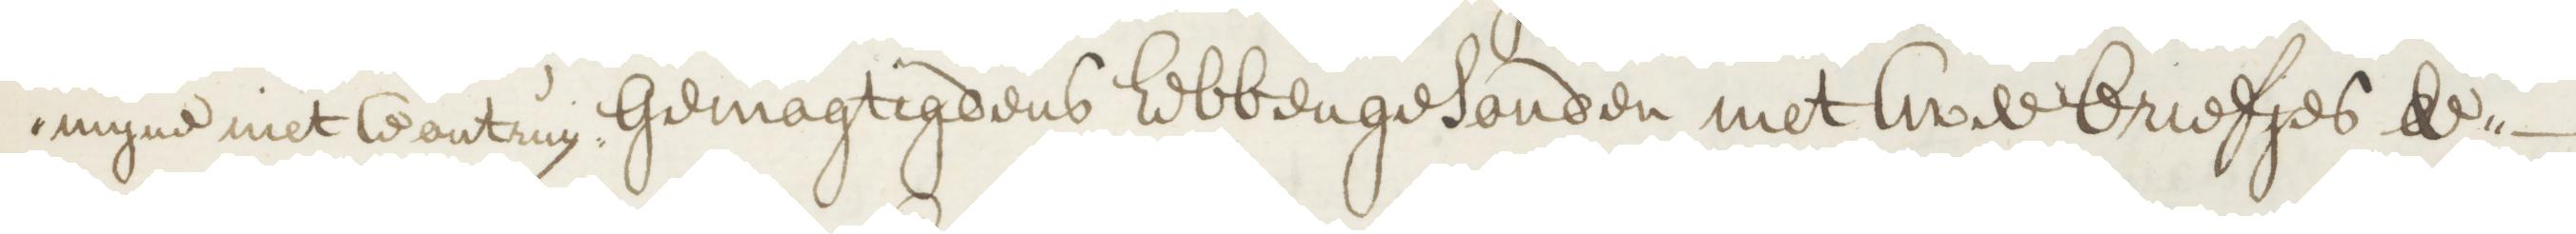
„mijn niet te ontruij„ gemagtigdens hebben gesonden met twee briefjes de„
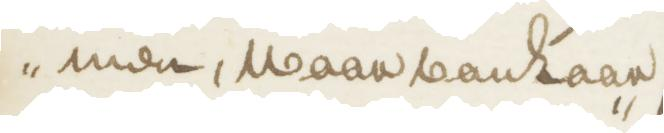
men, waar van haar„
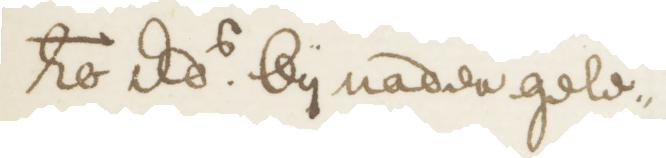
ho Ed.s bij nader gele„
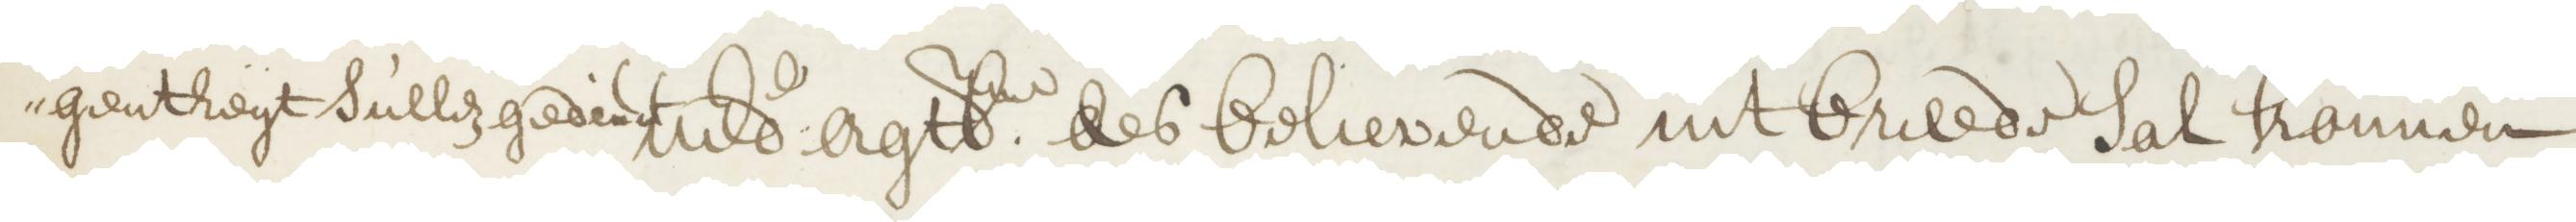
gentheijt sullen gedient uEd:e agtb. des believende in ’t breede sal konnen
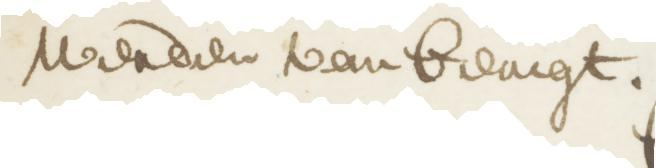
werden van berigt.
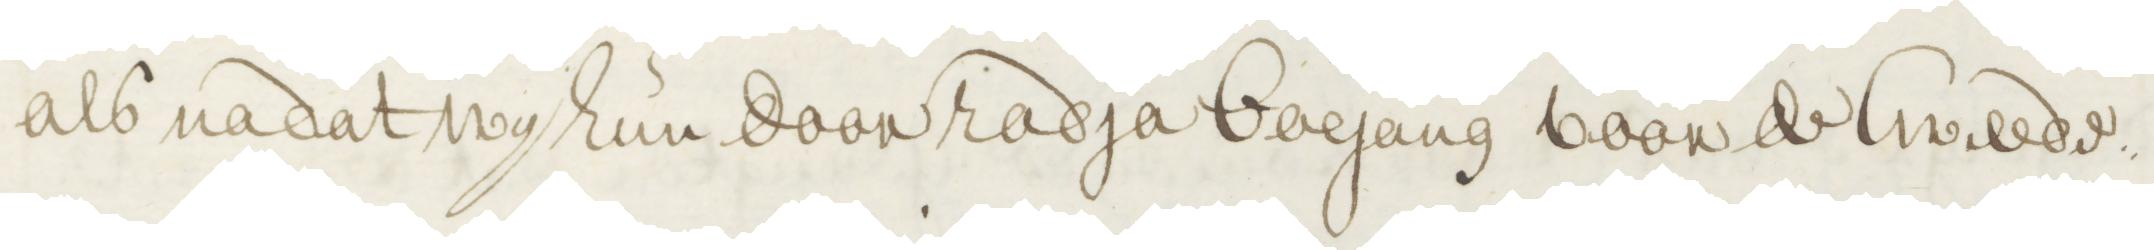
als nadat wij hun door radja boejang voor de tweede
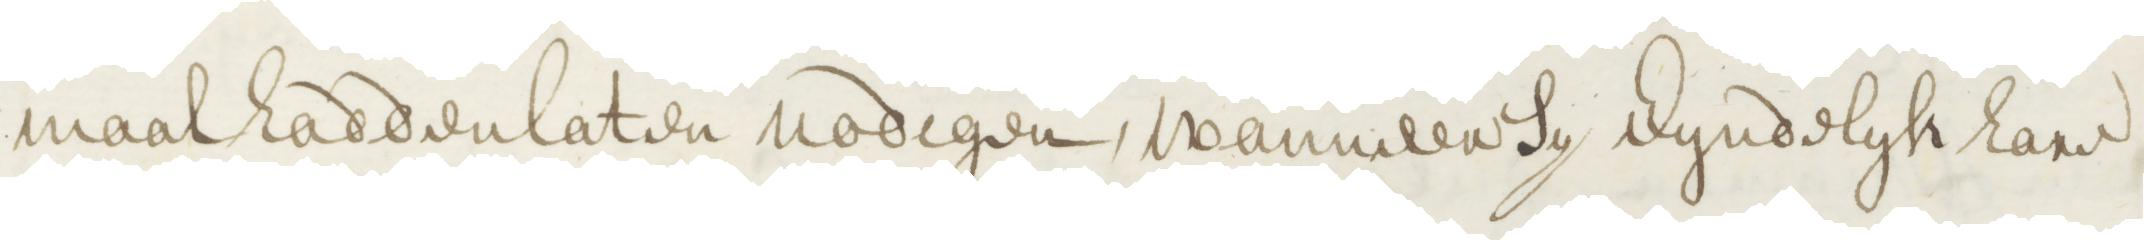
maal haddenlaten nodigen, wanneer sij Eijndelijk hare
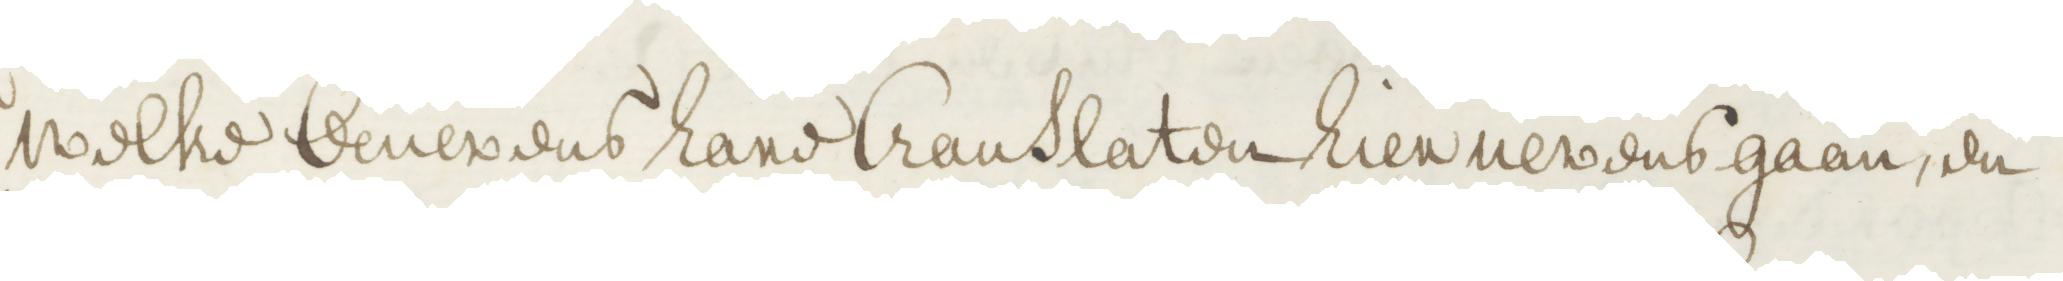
welke benevens hare translaten hier nevens gaan, en
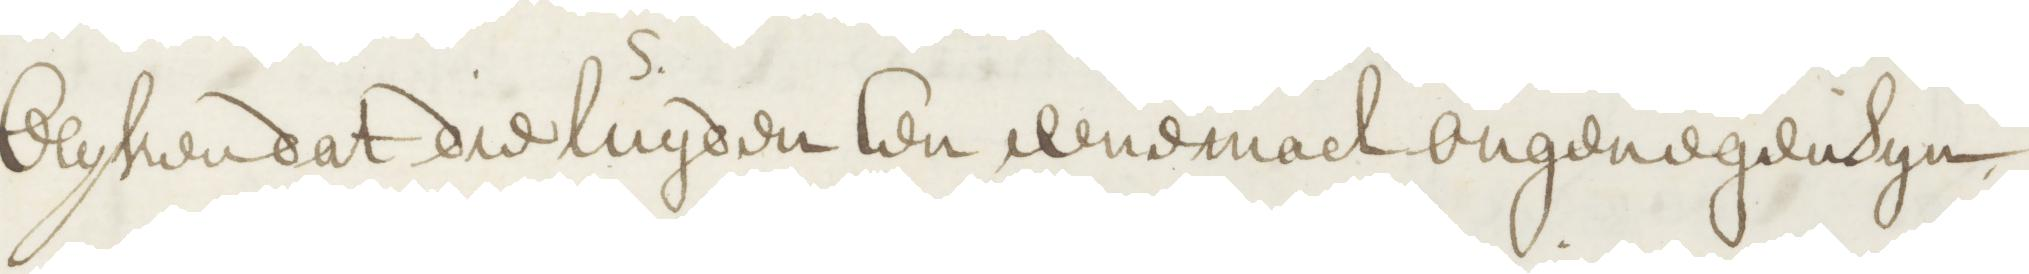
blyken dat die luyden ten eenemael ongenegensijn,
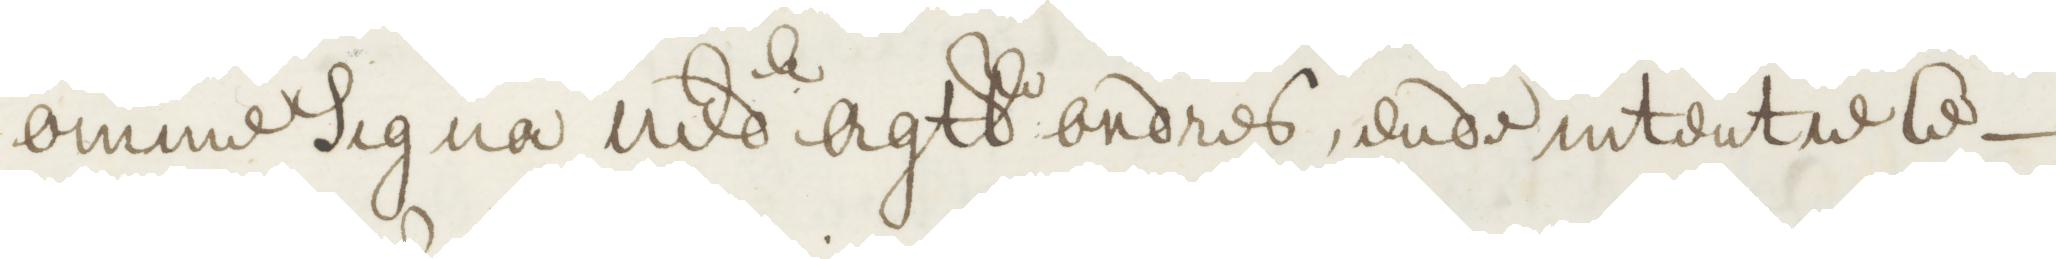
omme sig na uEd:le agtb: ordres, ende intentie te
